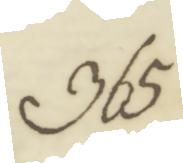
365
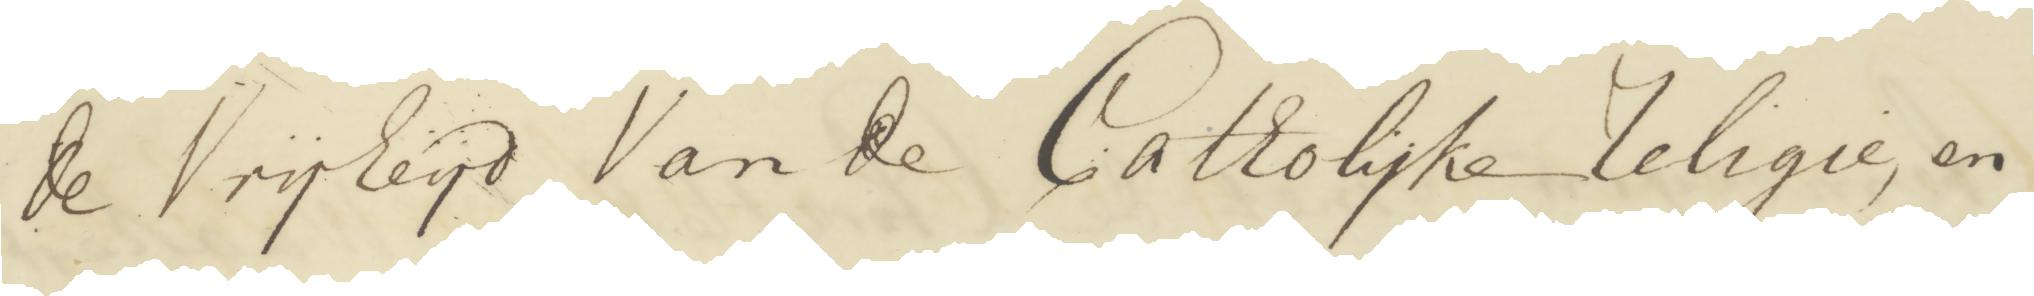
de vrijheijd van de Catholijke religie, en
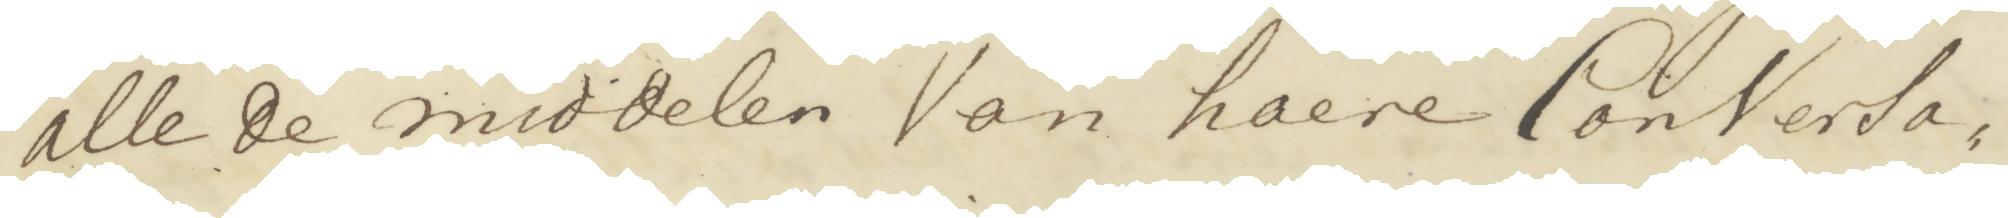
alle de middelen van haere Conversa„
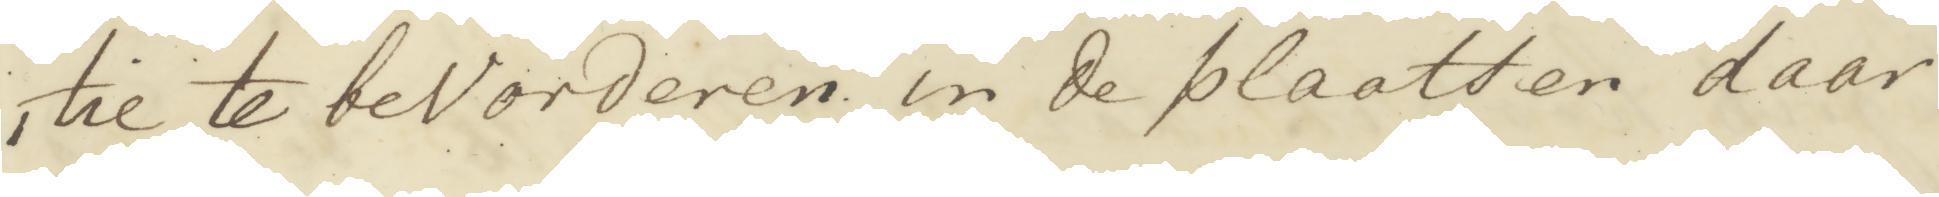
„tie te bevorderen in de plaatsen daar
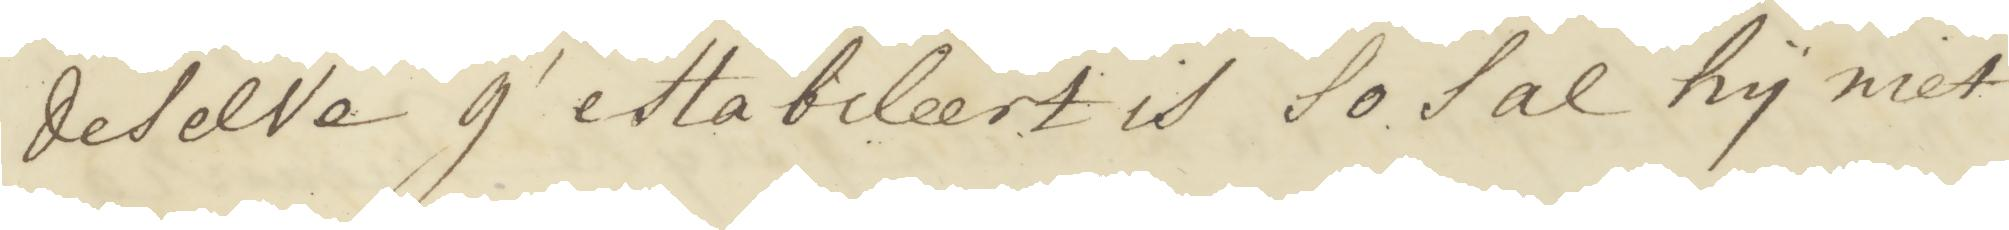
deselve g’estabileert is so sal hij niet
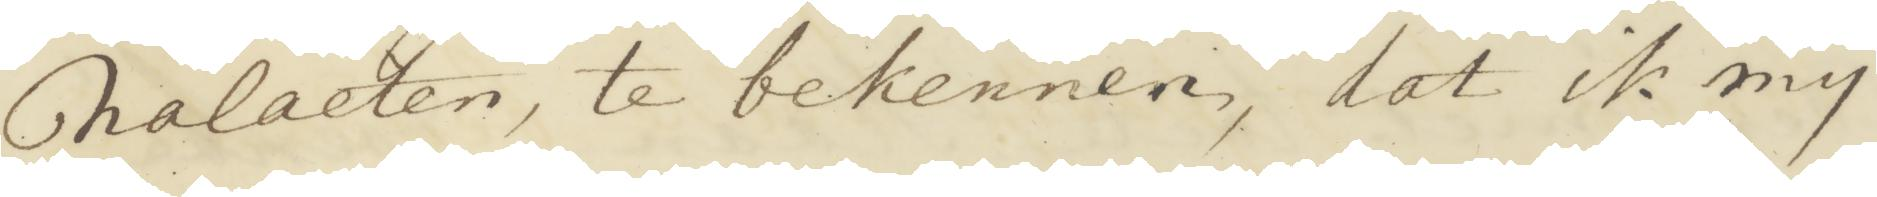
nalaeten, te bekennen, dat ik mij
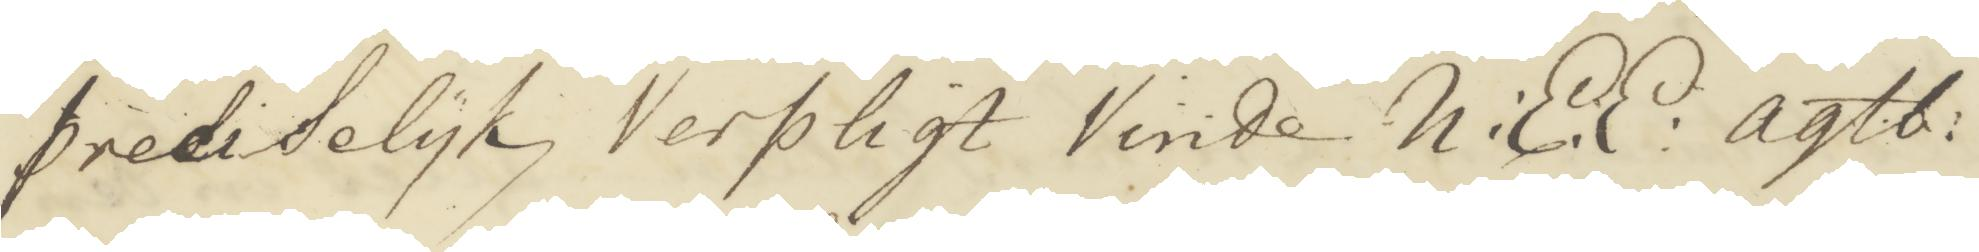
preciselijk verpligt vinde U:E:E: agtb:
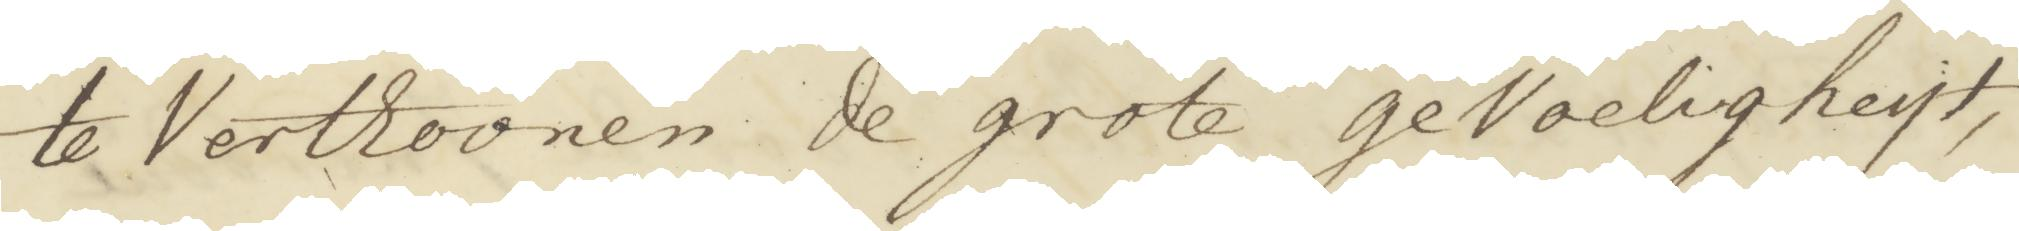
te verthoonen de grote gevoeligheijt,
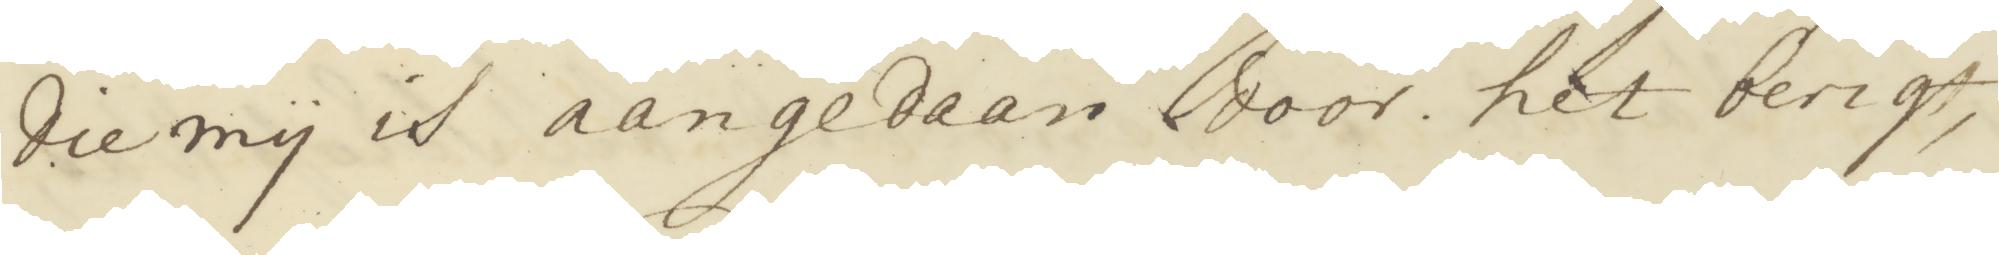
die mij is aangedaan door het berigt,
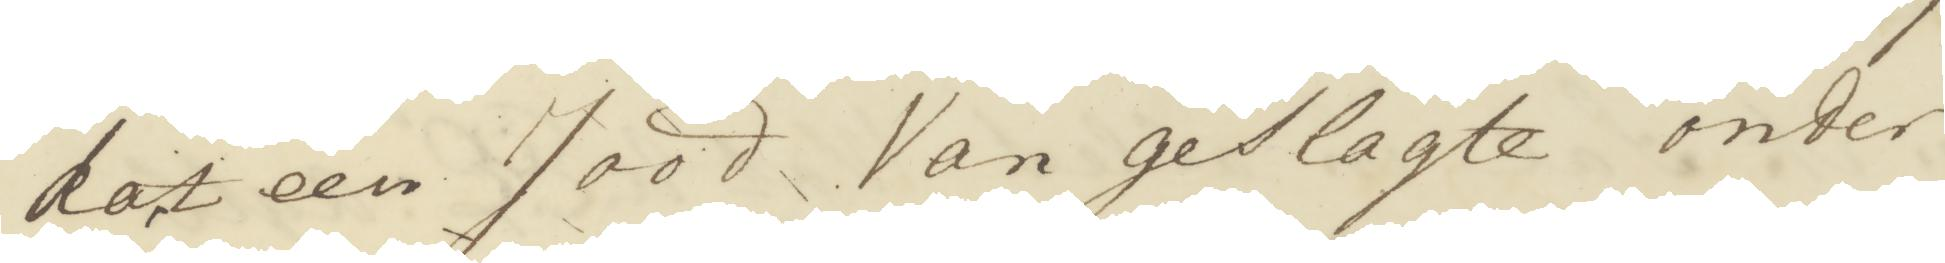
dat een Jood van geslagte onder
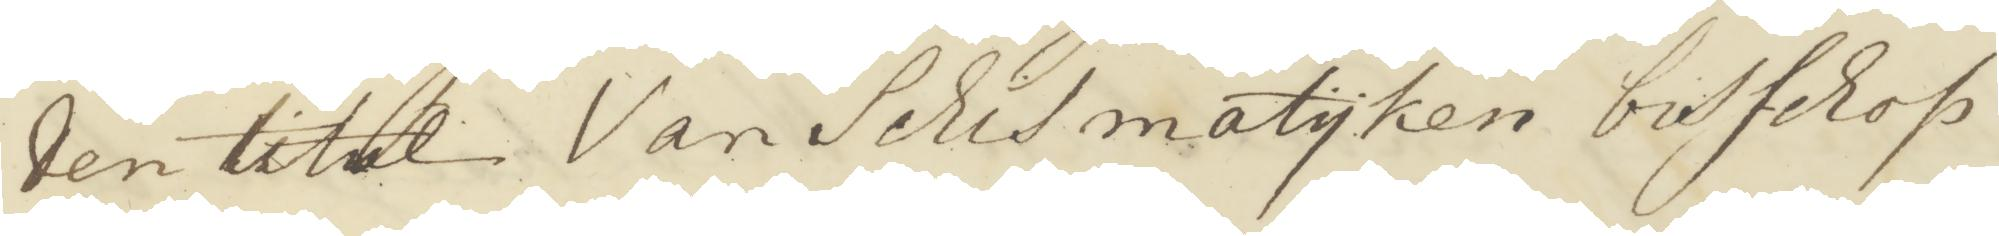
den titul van schismatijken bisschop
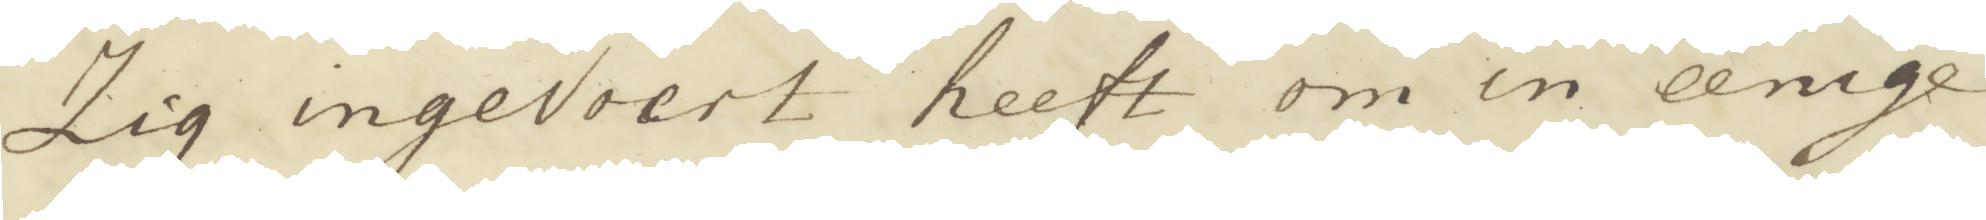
zig ingevoert heeft om in eenige
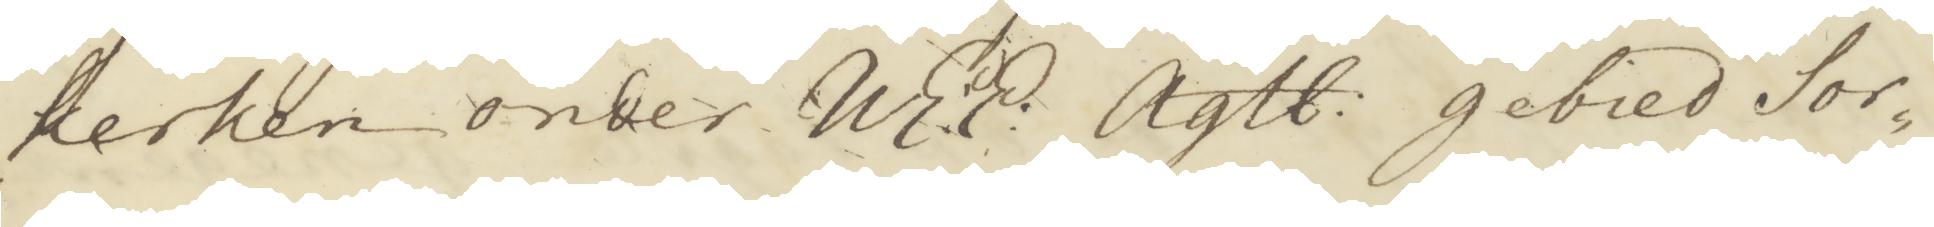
kerken onder UE:E: agtb: gebied sor„
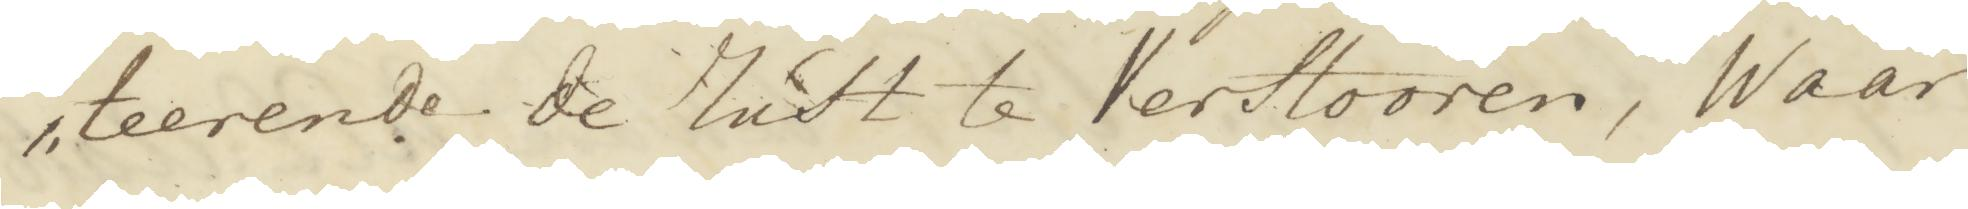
„teerende de rust te verstooren, waar
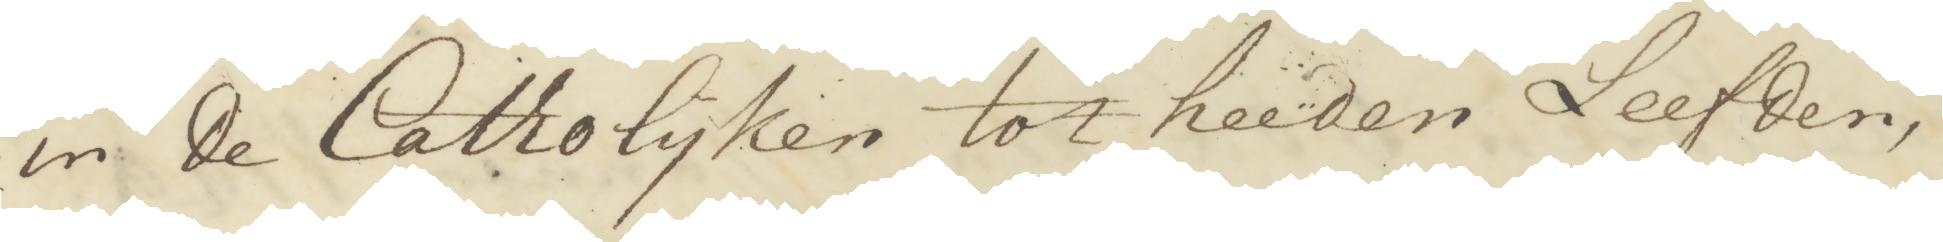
in de Catholijken tot heeden leefden,
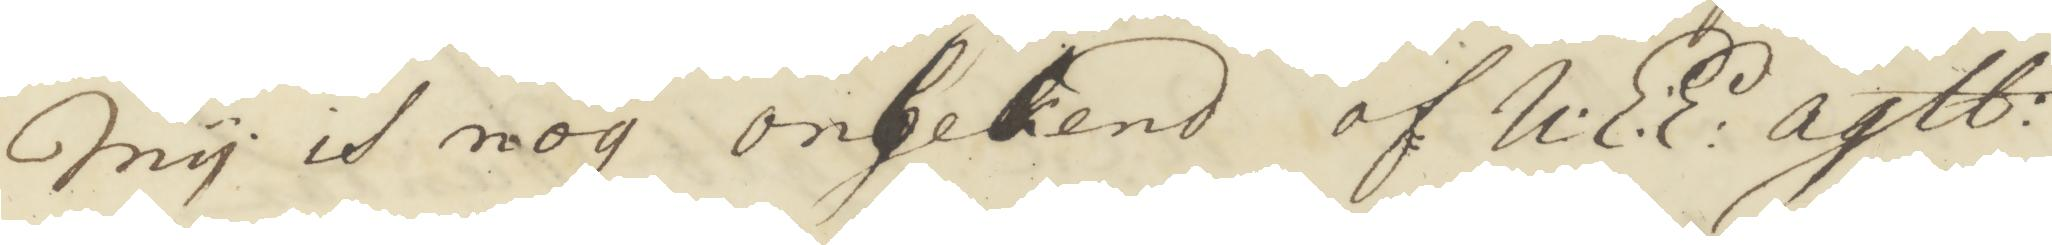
mij is nog onbekend of U:E:E: agtb:
